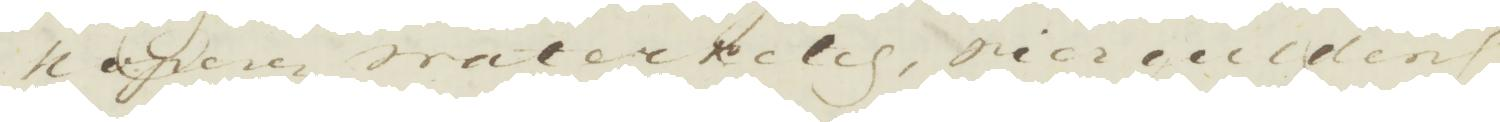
koperen waterketel, vier guldens
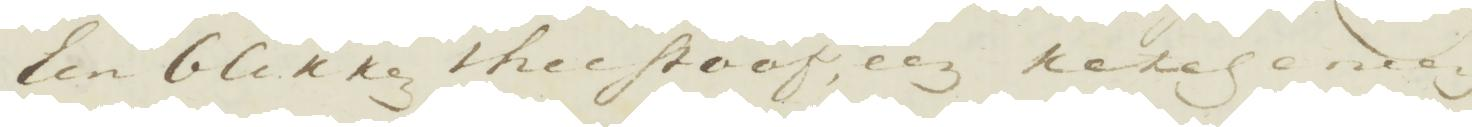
Een blikken theestoof, een ketel en een
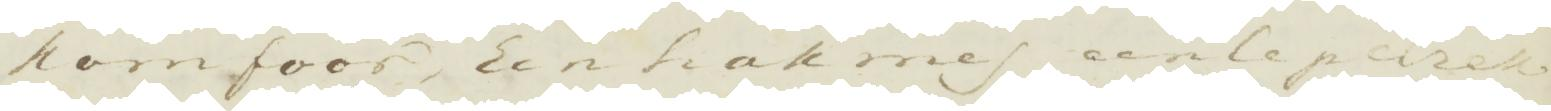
komfoor, Een hakmes een lepelrek
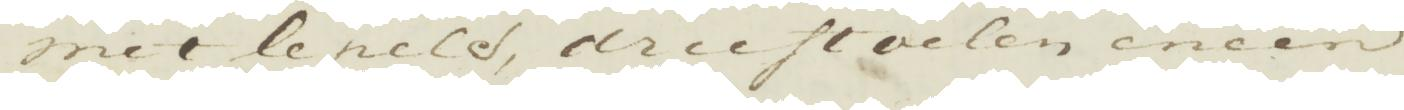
met lepels, drie stoelen en een
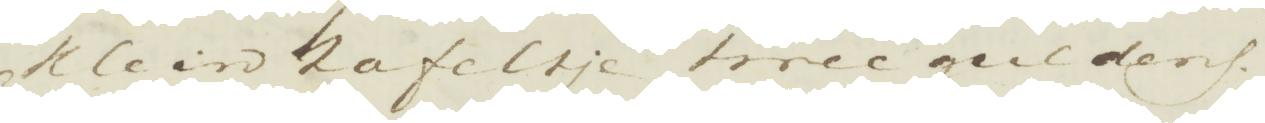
klein tafeltje twee guldens.
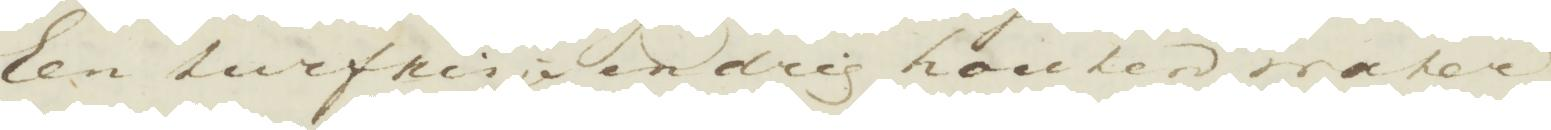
Een turfkisje en drie houten water
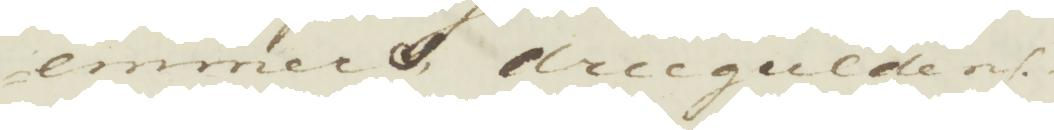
emmers, drie guldens.
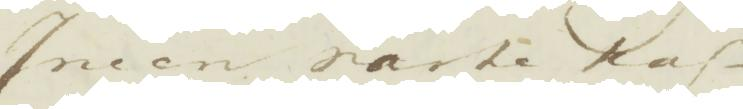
In een vaste kas
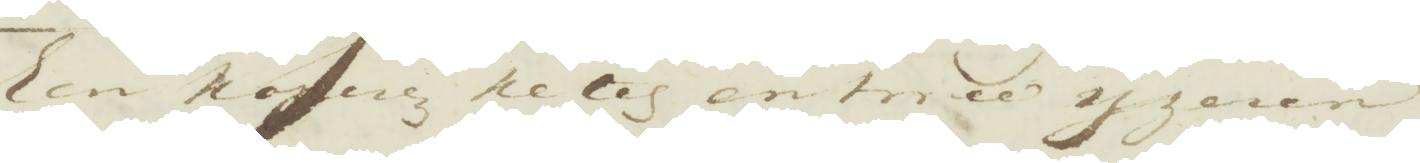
Een koperen ketel en twee yzeren
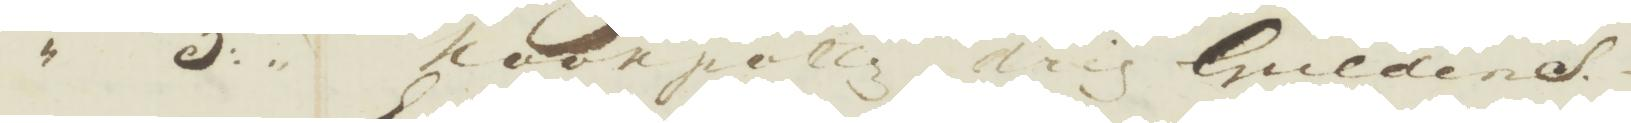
„ 3: „ kookpotten, drie Guldens.
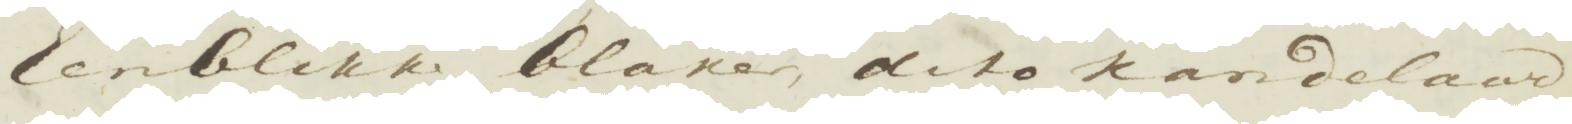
Een blikken blaker, dito kandelaar
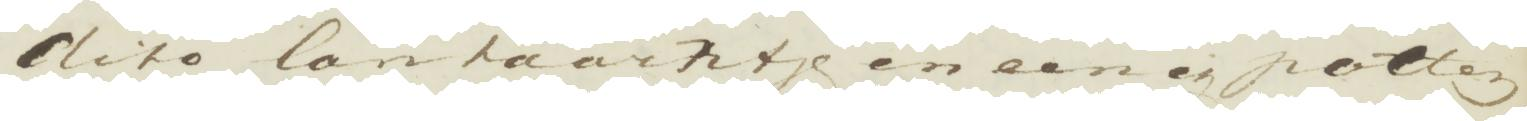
dito lantaarntje en een eij potten
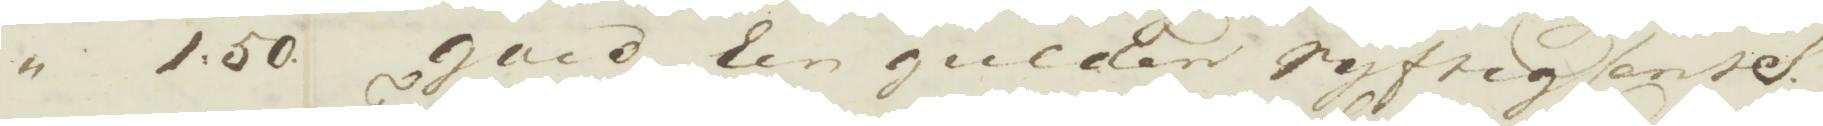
„ 1:50 goed, Een gulden vyftig Cents.
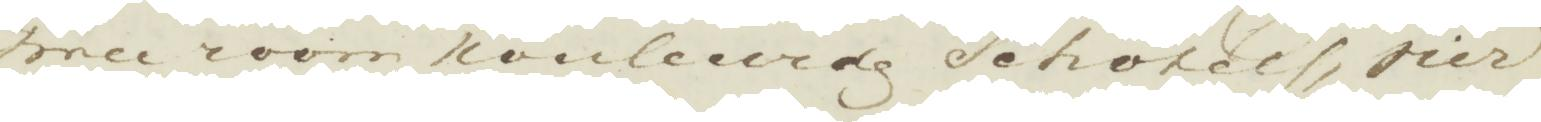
Twee room kouleurde schotels, vier
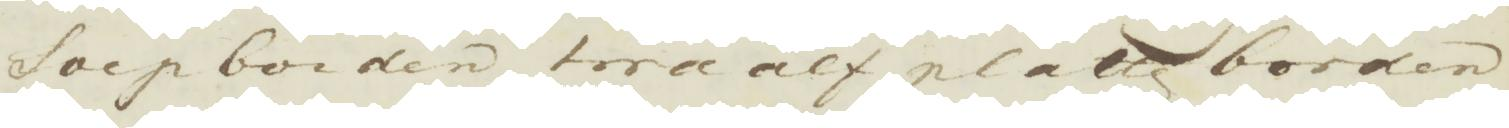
soepborden, twaalf platte borden
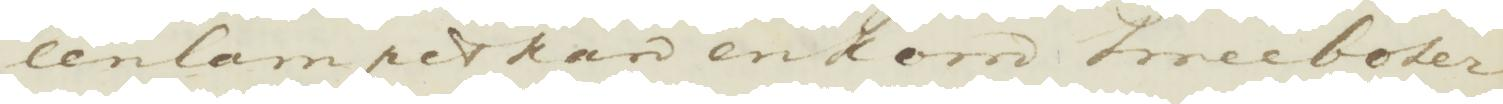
een lampetkan en kom twee boter
